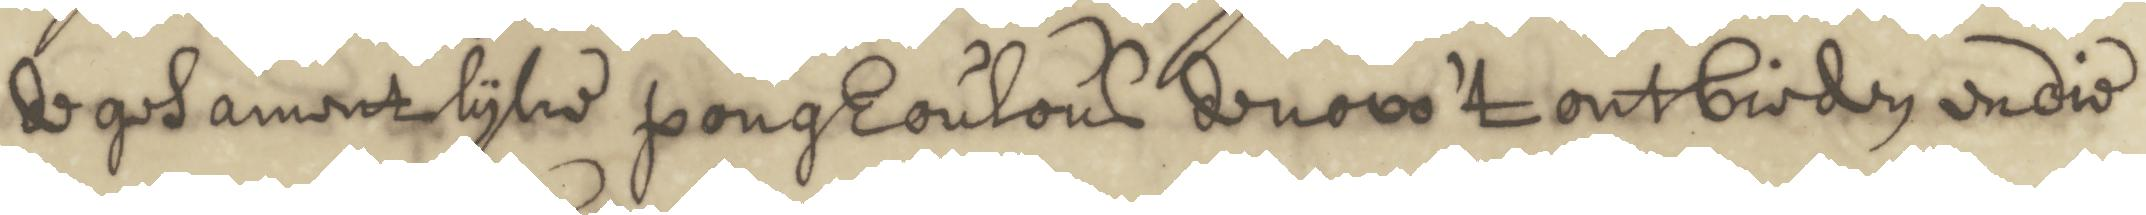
de gesamentlijke ponghoulous denovo ’t ontbieden en die
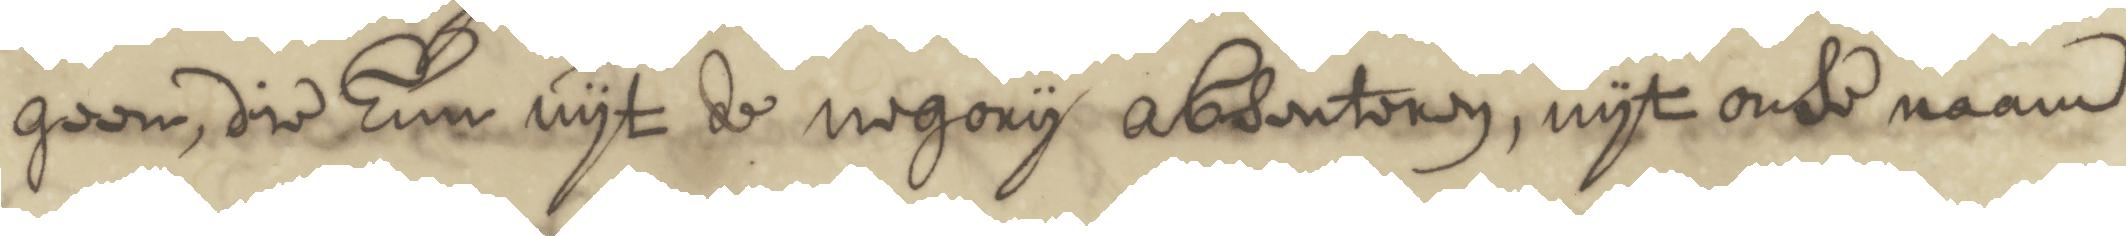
geen, die hun uijt de negorij absenteren, uijt onse naam
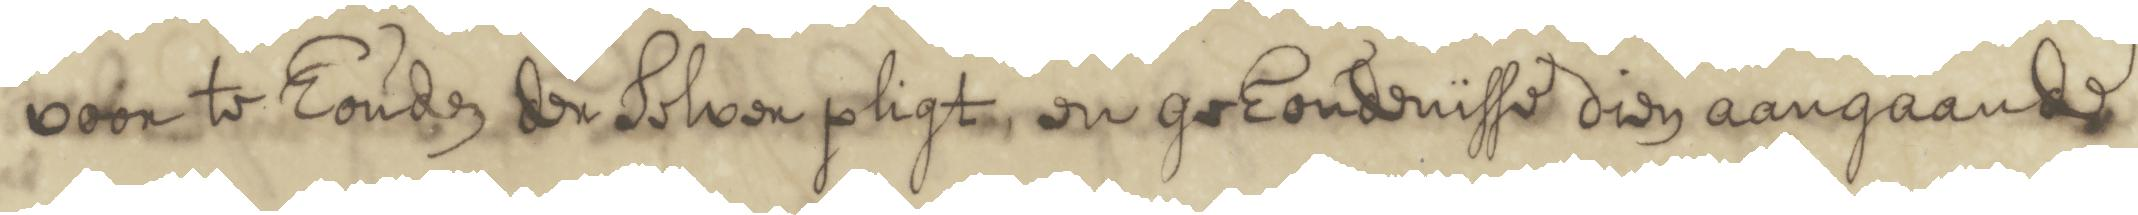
voor te houden derselver pligt, en gehoudenisse dien aangaande
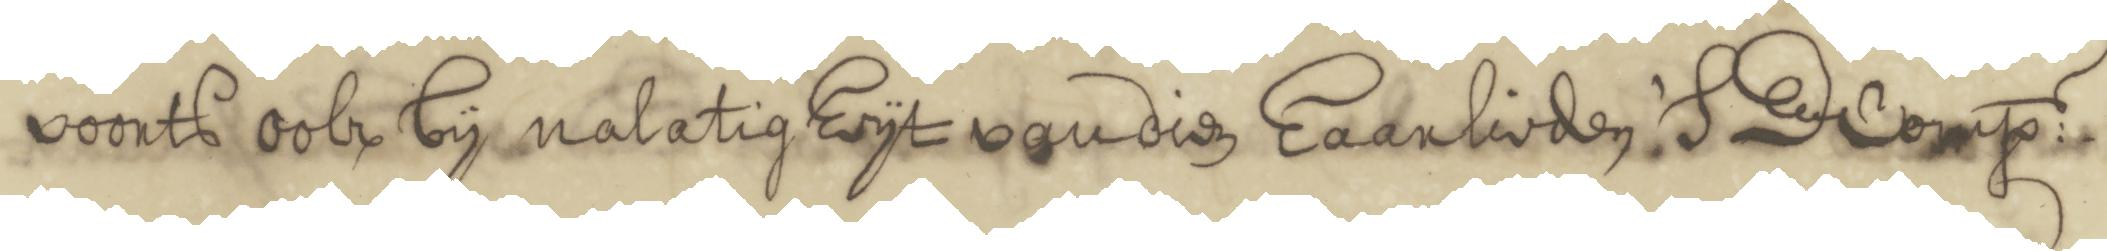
voorts ook bij nalatigheijt van dien haarlieden 's E Comp:s
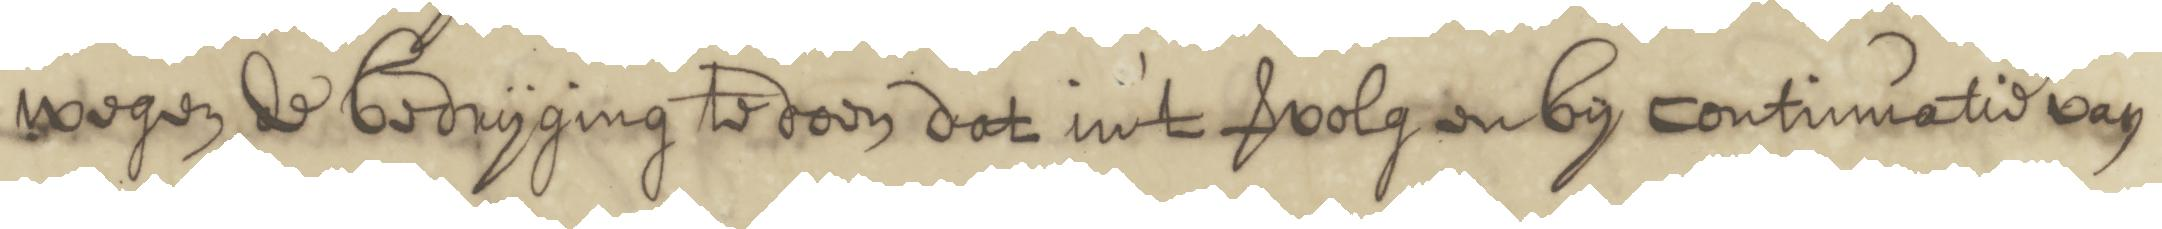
wegen de bedrijging te doen dat in ’t vervolg en bij continuatie van
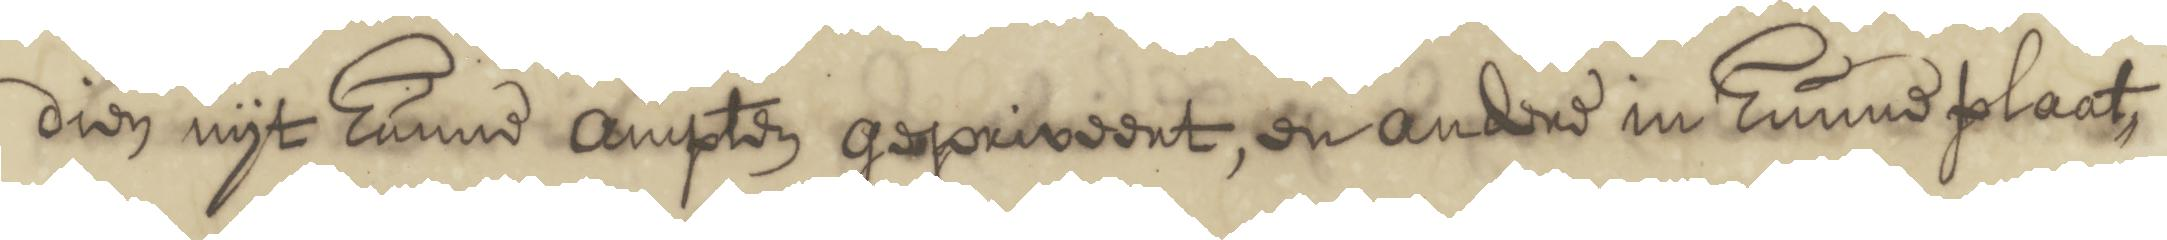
dien uijt hunne Ampten gepriveert, en andere in hunne plaat„
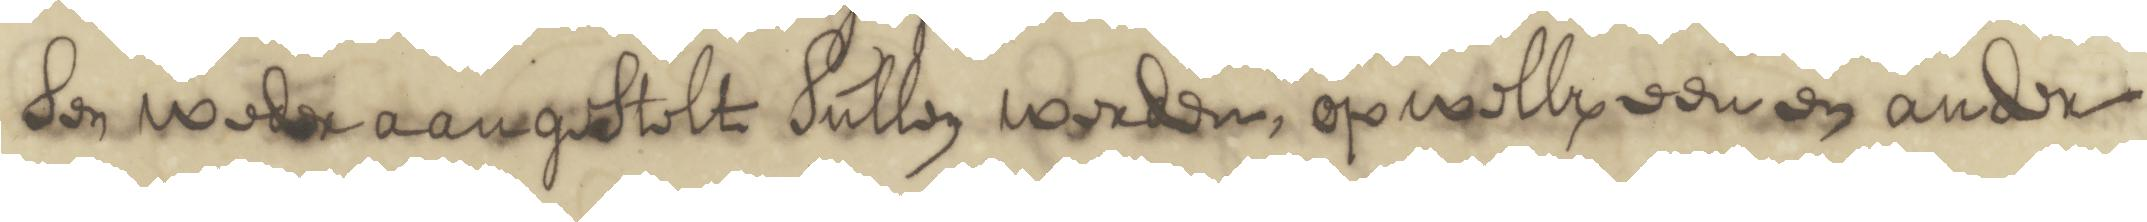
sen weder aangestelt sullen werden, op welk een en ander
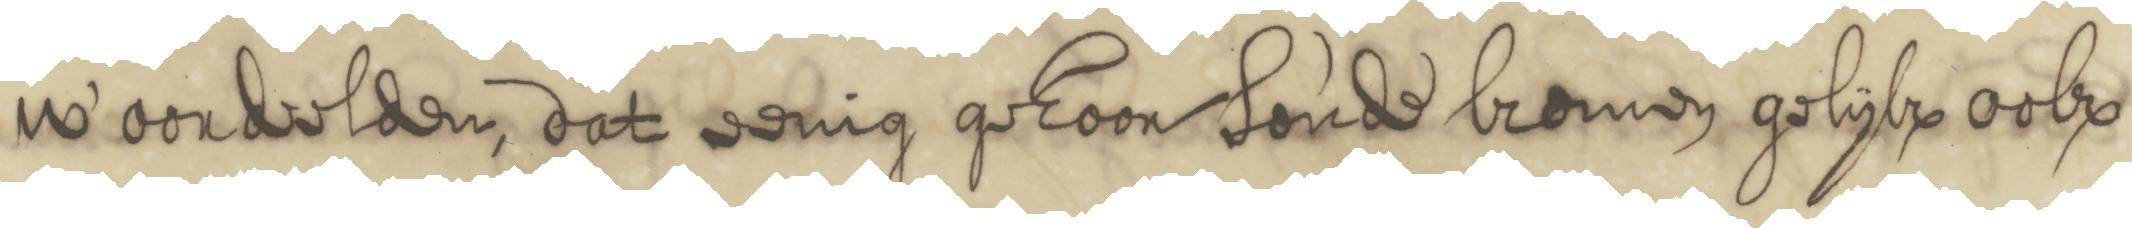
w' oordeelden, dat eenig gehoor soude komen gelijk ook
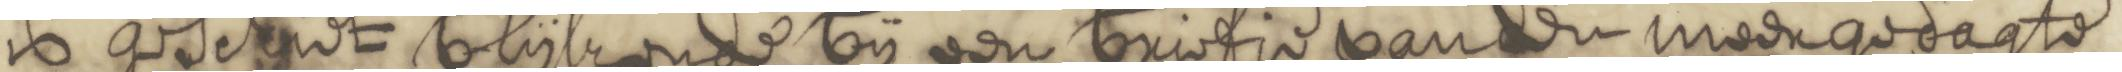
is geschiet blijkende bij een briefje van den meergedagte
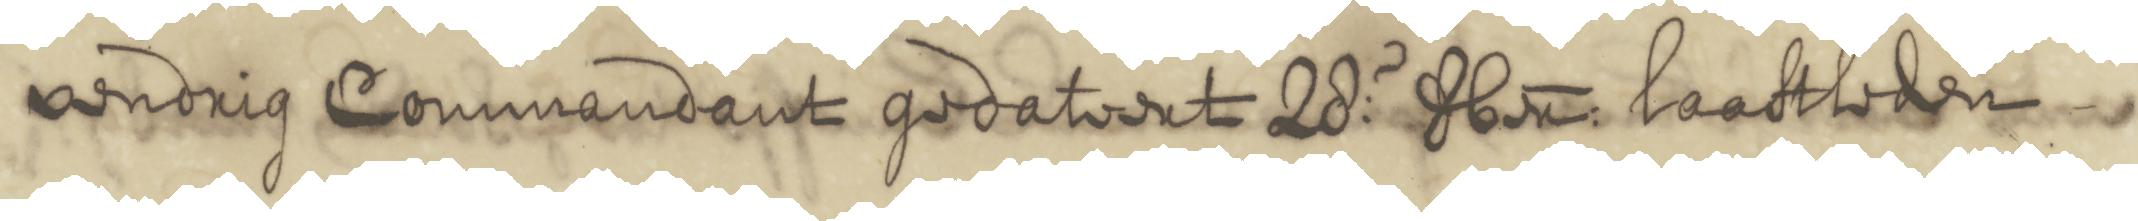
vendrig Commandant gedateert 28:' fber: laastleden
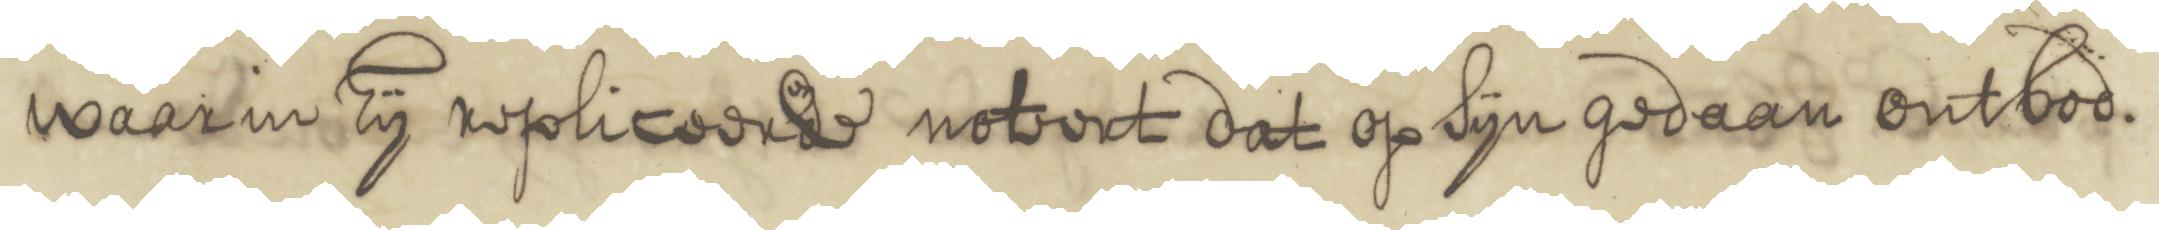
waar in hij repliceerde noteert dat op sijn gedaan ontbod.
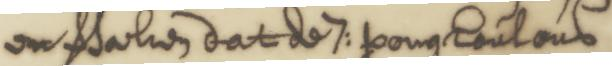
en versoeken dat de 7: ponghoulous
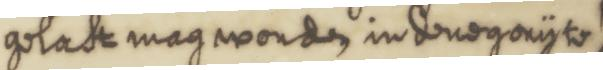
gelast mag worden in de negorij te
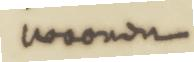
woonen
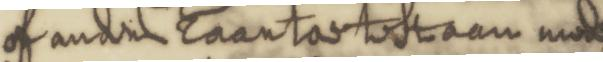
of anders haar toetestaan mede
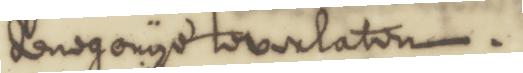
de negorije te verlaten.
